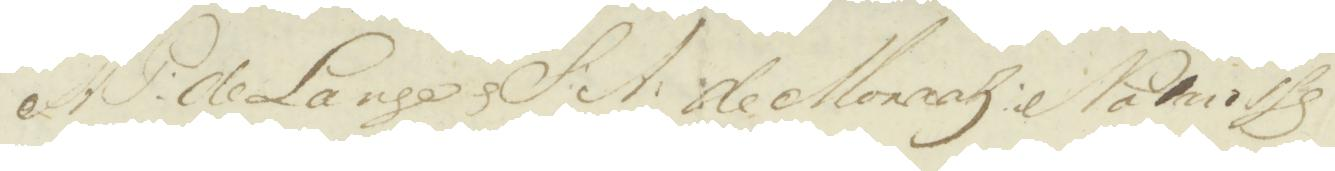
AP: de Lange & S.A: de Moraal Notarissen
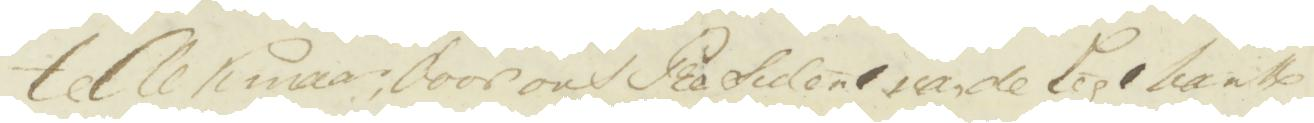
te Alkmaar, door ons President van de Regtbank
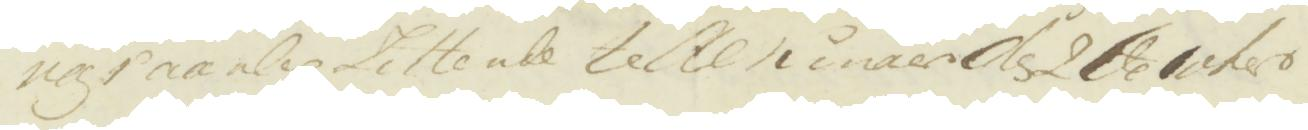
na 1e aanleg Zittende te Alkmaar naer den 2 October
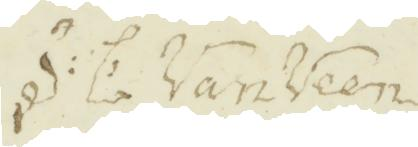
I: L: Van Veen
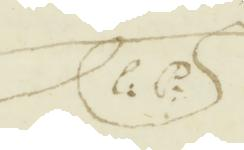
C: P:
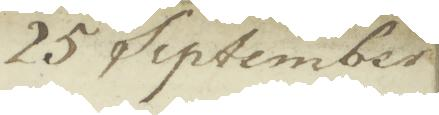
25 september
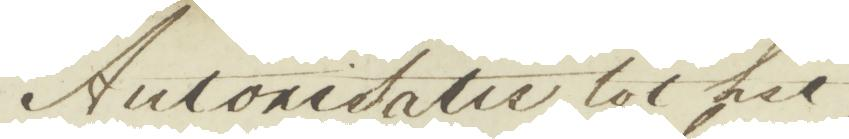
Autorisatie tot het
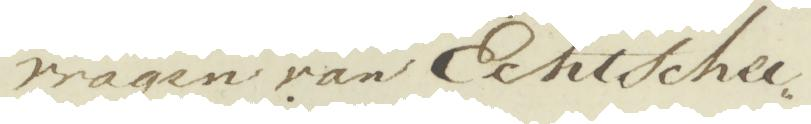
vragen van Echtschei„
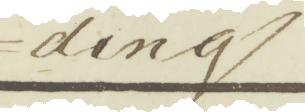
=ding
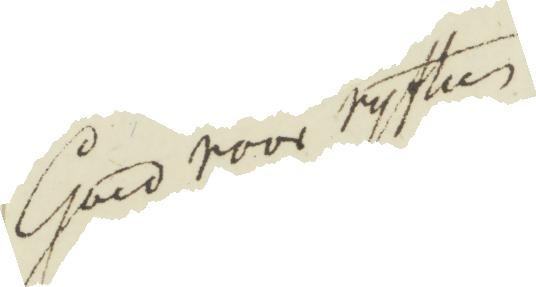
Goed voor vyftien
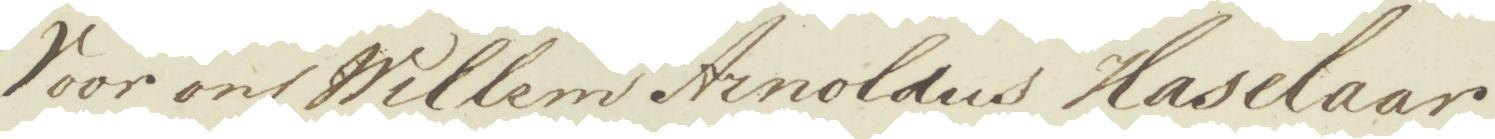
Voor ons Willem Arnoldus Haselaar
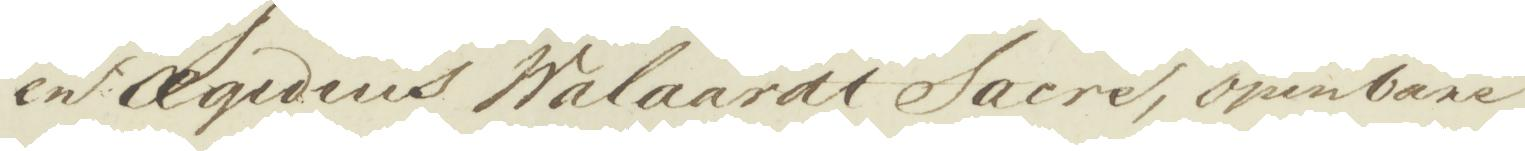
en Aegidius Walaardt Sacré, openbare
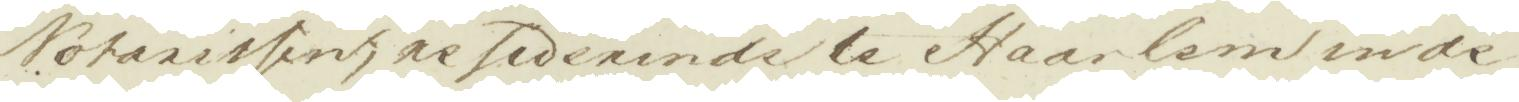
Notarissen, residerende te Haarlem in de
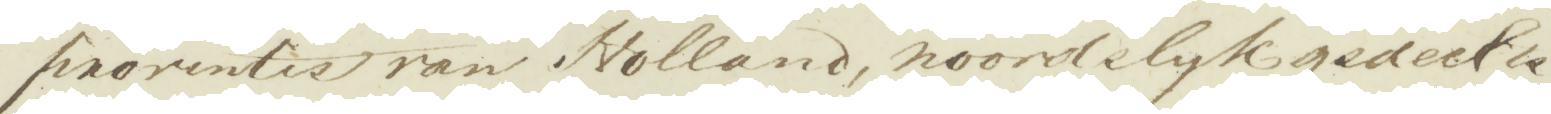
provintie van Holland, noordelyk gedeelte
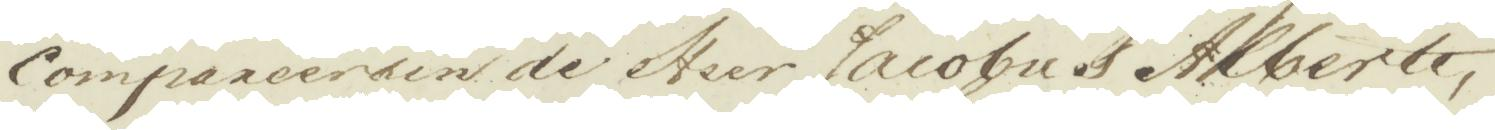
Compareerden de Heer Jacobus Alberti,
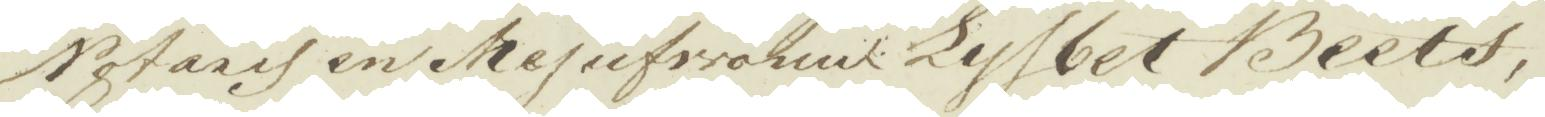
Notaris en Mejufvrouw Lysbet Beets,
